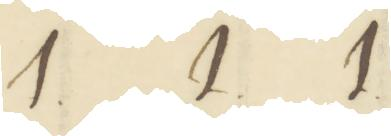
1. 1. 1
